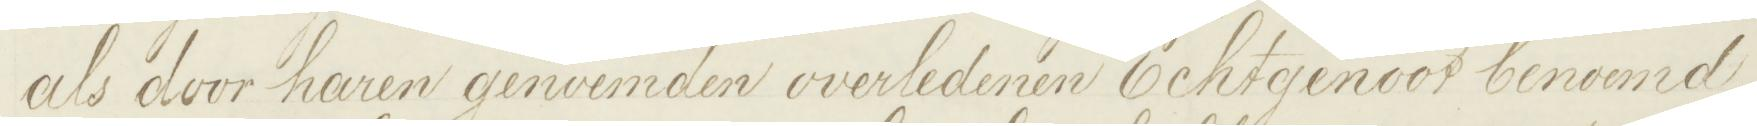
als door haren genoemden overledenen Echtgenoot benoemd
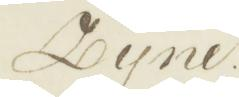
Zyne.
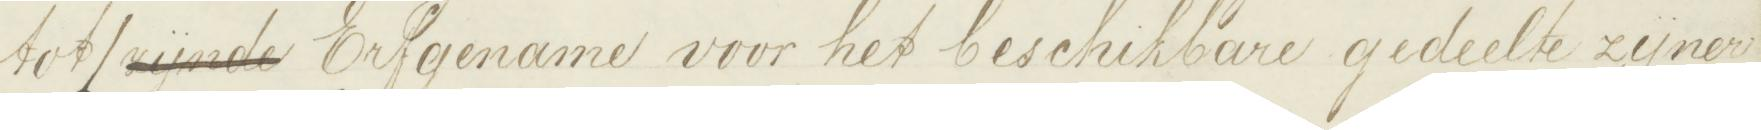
tot / zijnde Erfgename voor het beschikbare gedeelte zijner
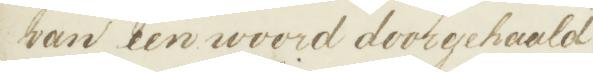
van één woord doorgehaald
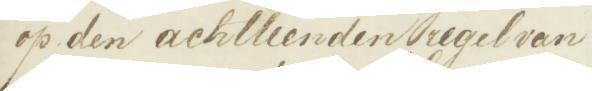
op den achttienden regel van
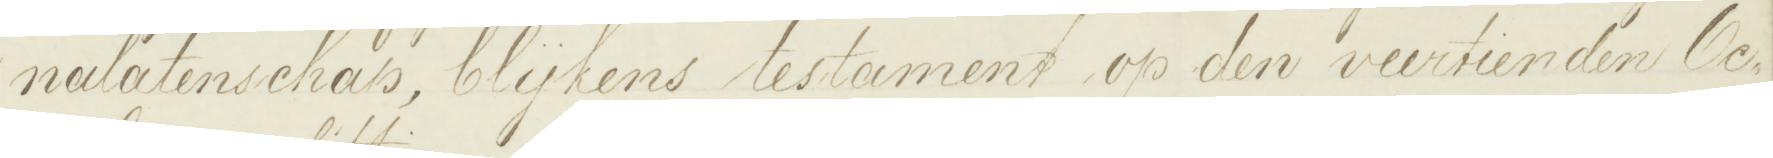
nalatenschap, blijkens testament, op den veertienden Oc„
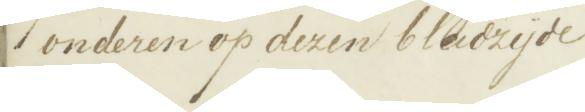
onderen op dezen bladzijde
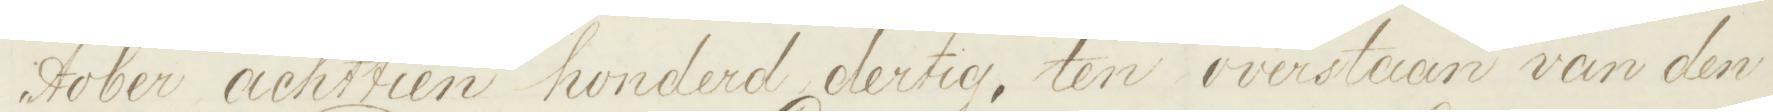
„tober achttien honderd dertig, ten overstaan van den
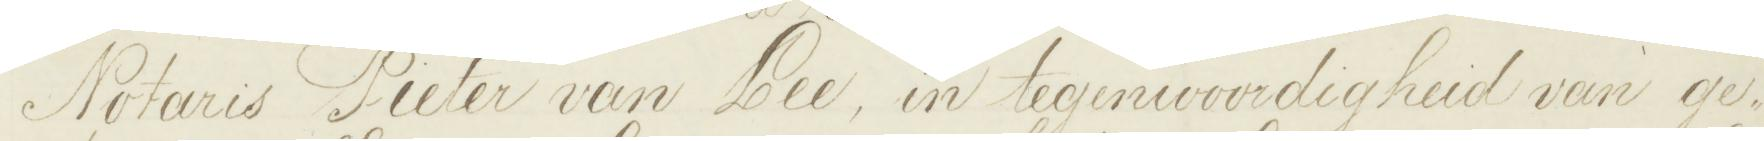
Notaris Pieter van Lee, in tegenwoordigheid van ge„
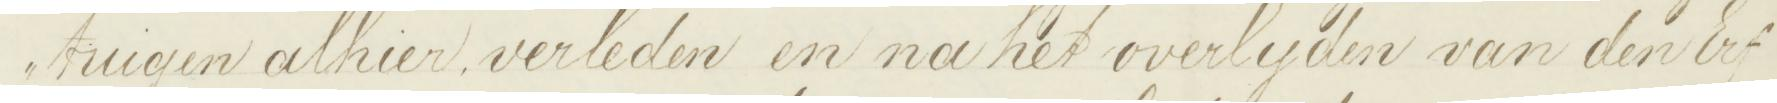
„tuigen alhier, verleden en na het overlyden van den Erf
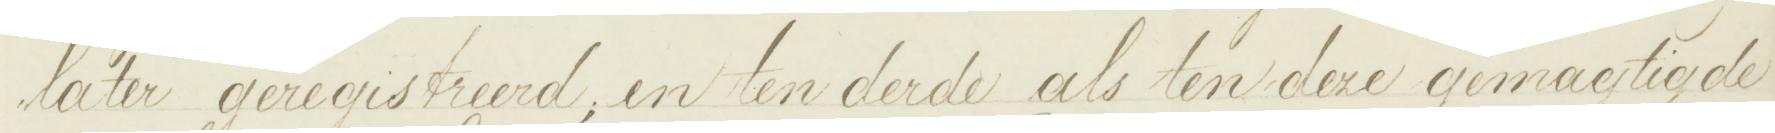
„later geregistreerd, en ten derde als ten deze gemagtigde
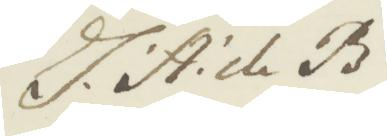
I: A: de B
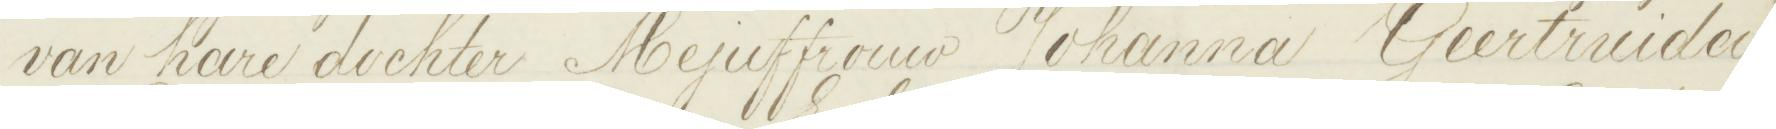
van hare dochter Mejuffrouw Johanna Geertruida
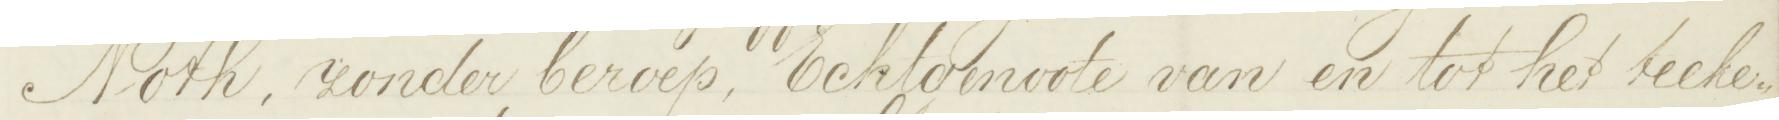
Noth, zonder beroep, Echtgenoote van en tot het teeke„
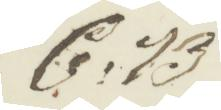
C: B
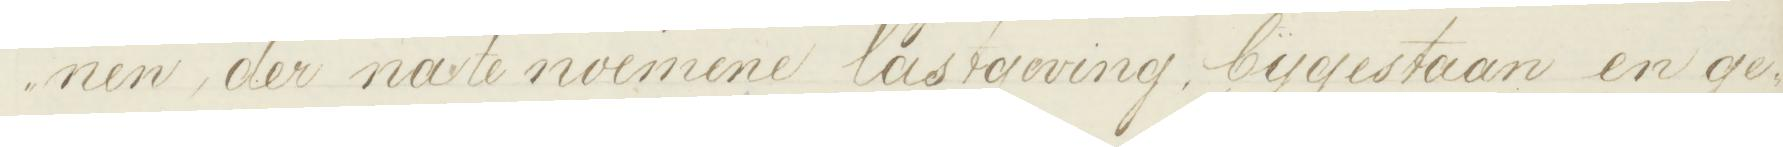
„nen, der na te noemene lastgeving, bijgestaan en ge„
